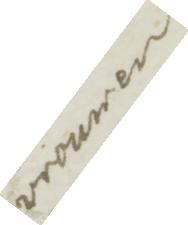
vrouwen
